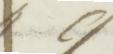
„ 9
